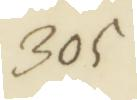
305
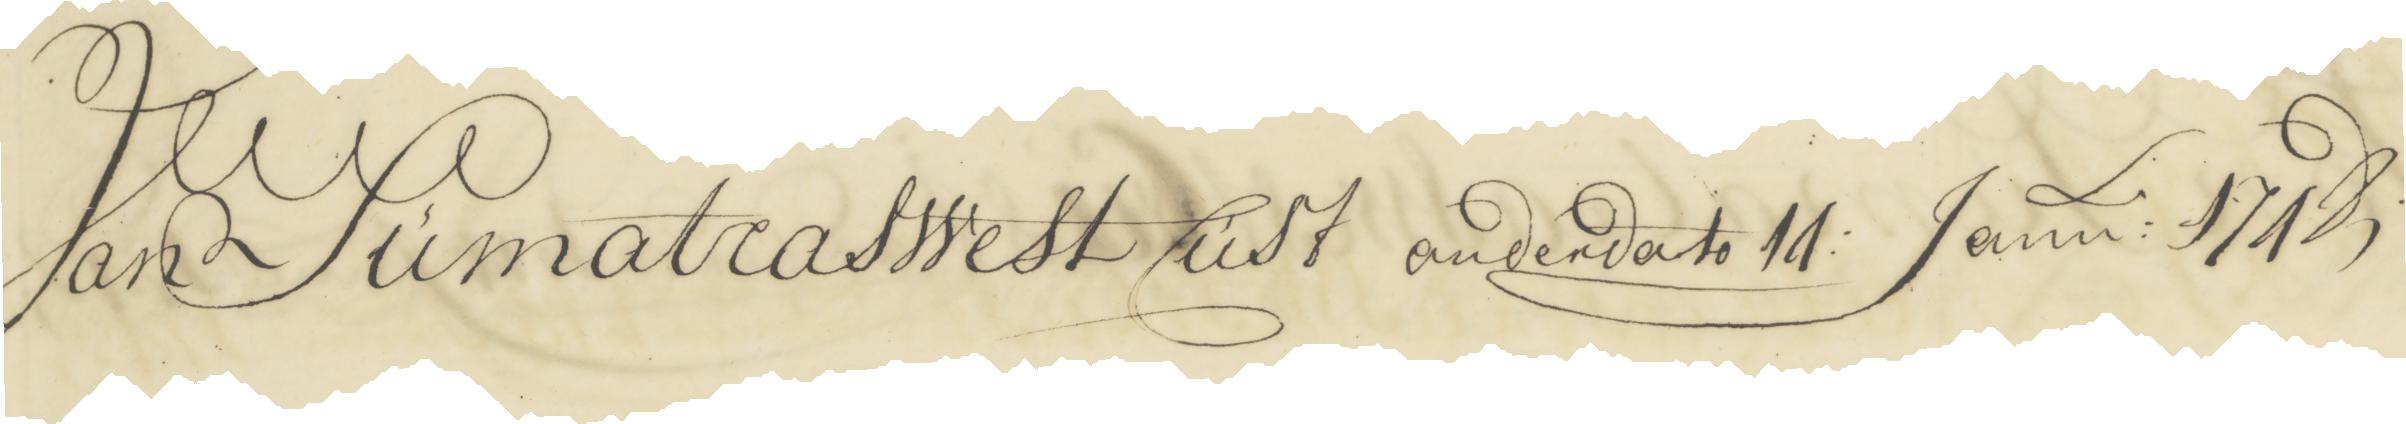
Van Sumatras West Cust onderdato 14: Janu: 1748;
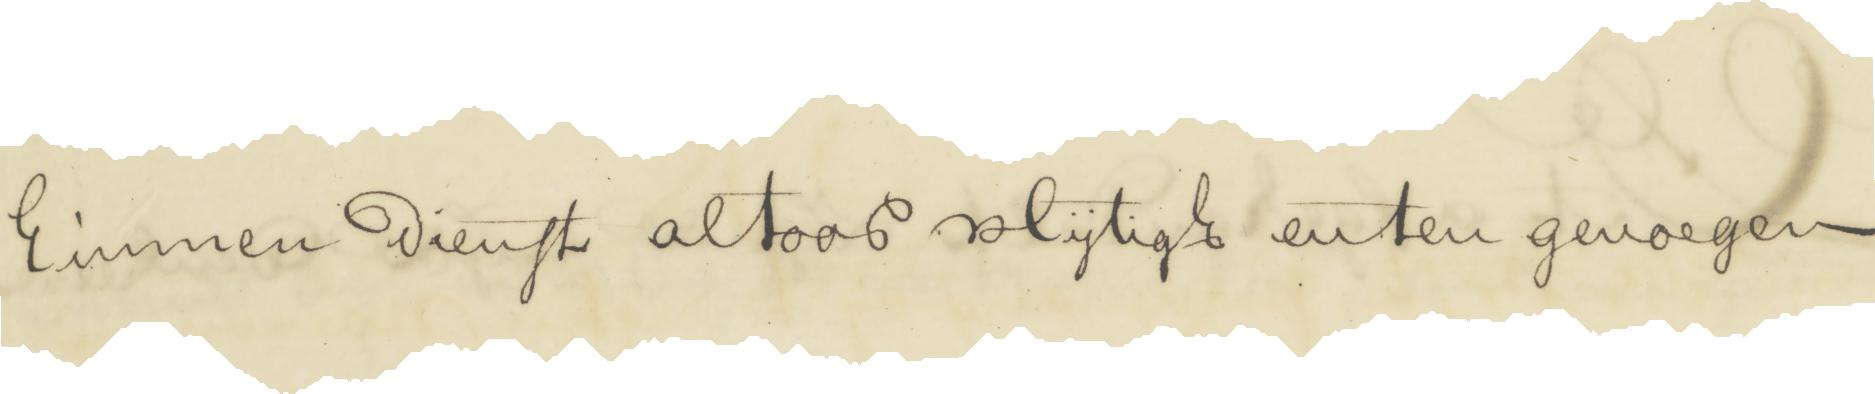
hunnen dienst altoos vlijtigh en ten genoegen
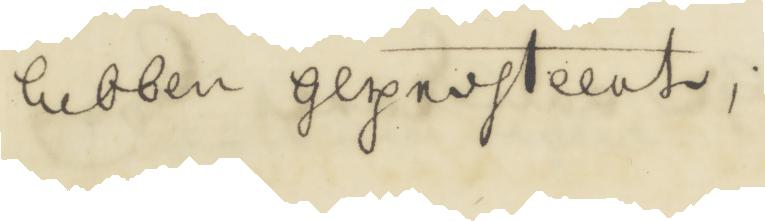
hebben gepresteert;
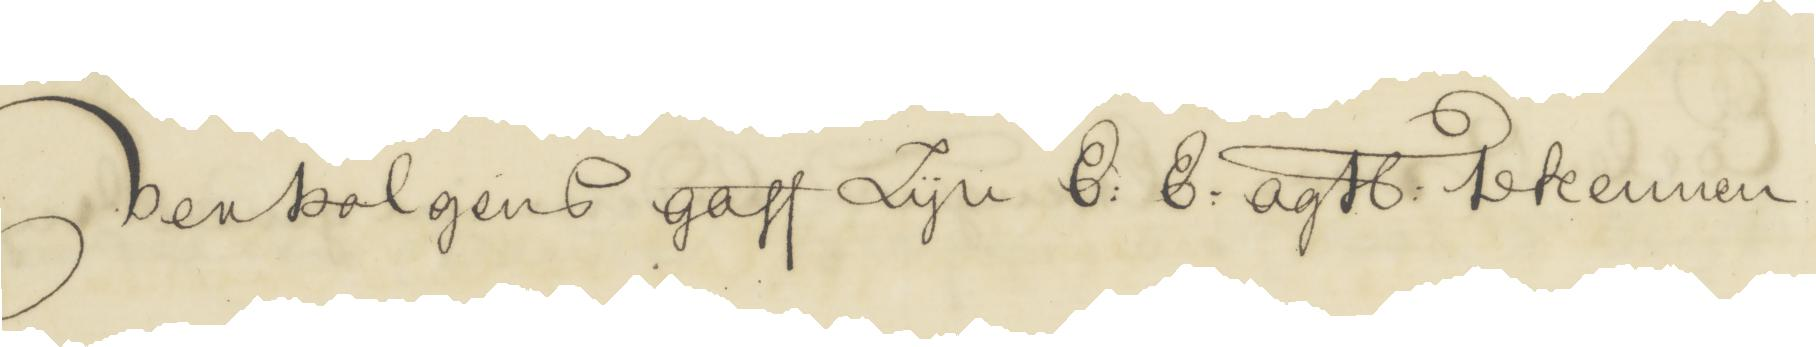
Vervolgens gaff zijn E: E: agtb: tekennen
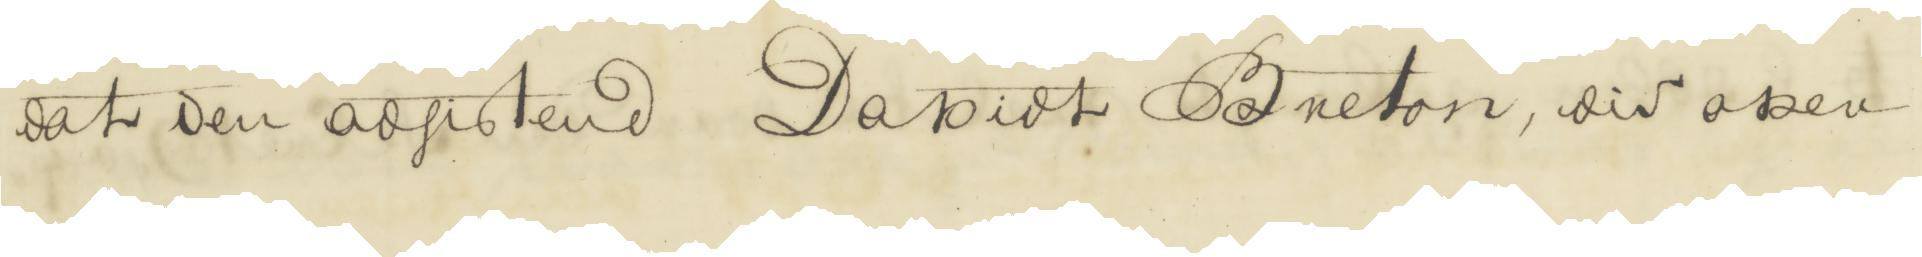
dat den adsistend Davidt Breton, die over
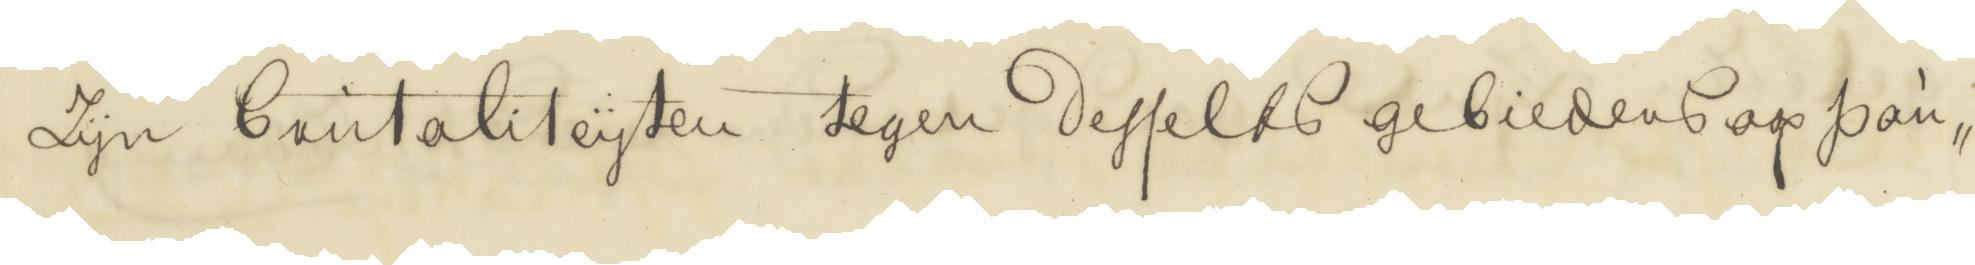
zijn brutaliteijten tegen desselfs gebieders op pau„
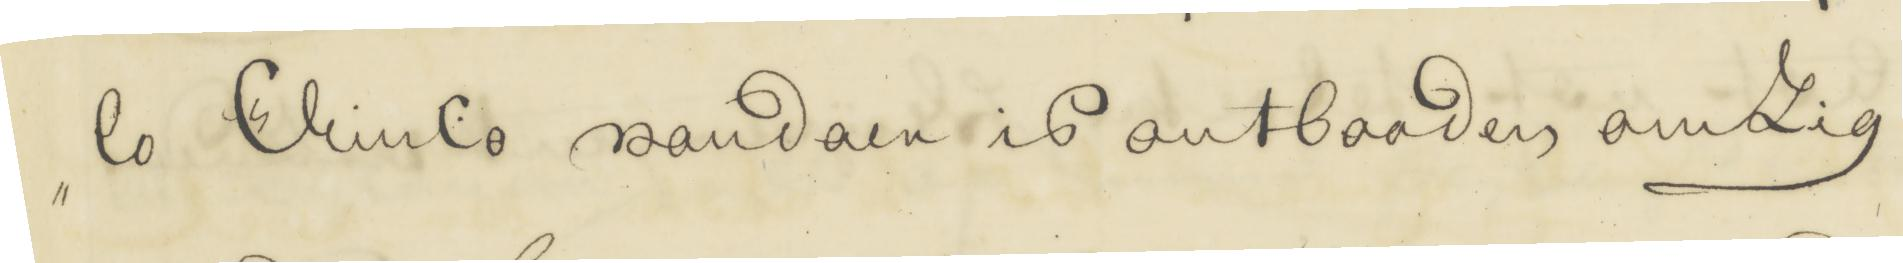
„ lo Chinco vandaer is ontbooden om zig
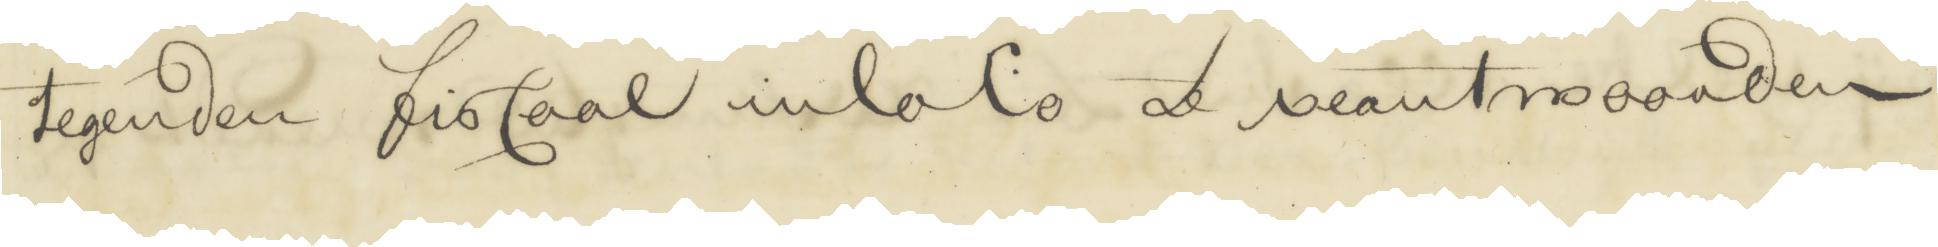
tegenden fiscaal inloco te veantwoorden
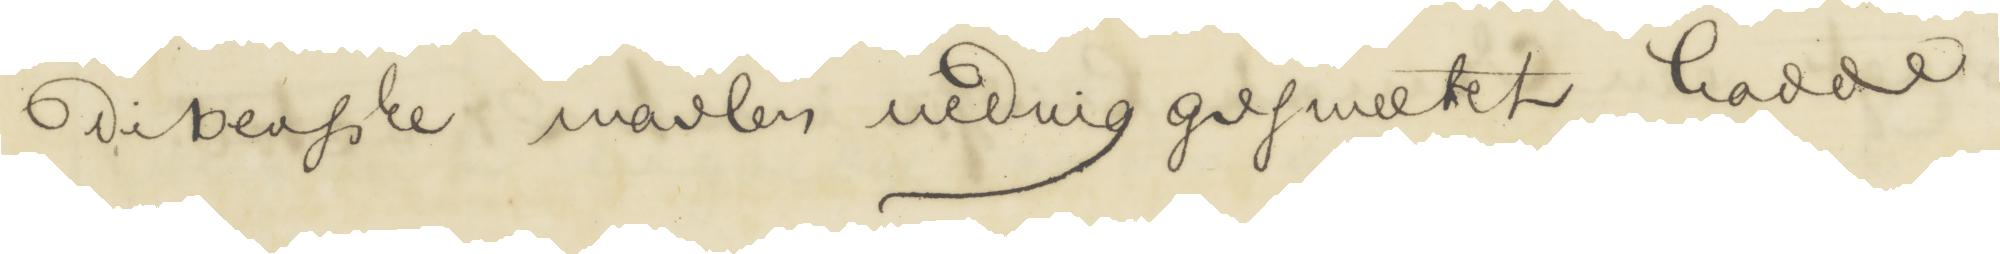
diversche maelen nedrig gesmeekt hadde
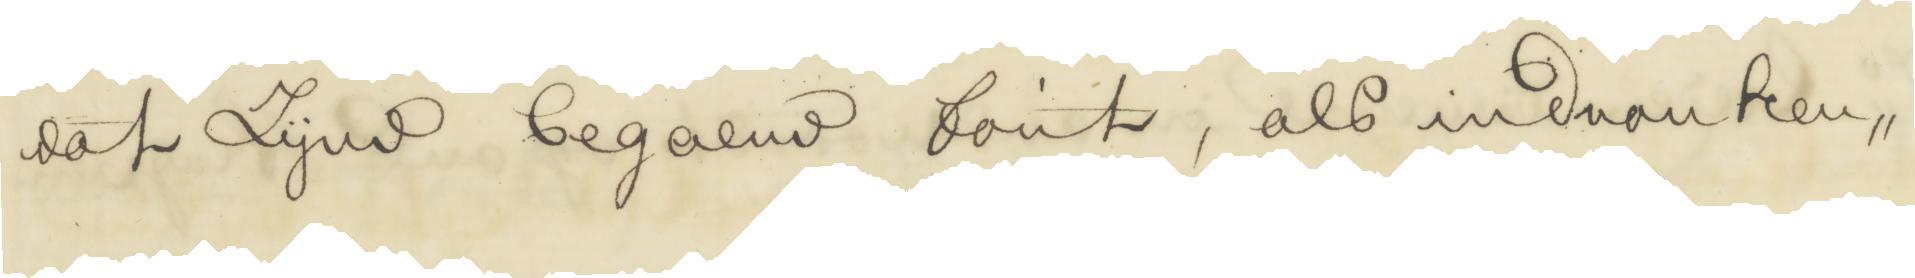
dat zijne begaene fout, als indronken„
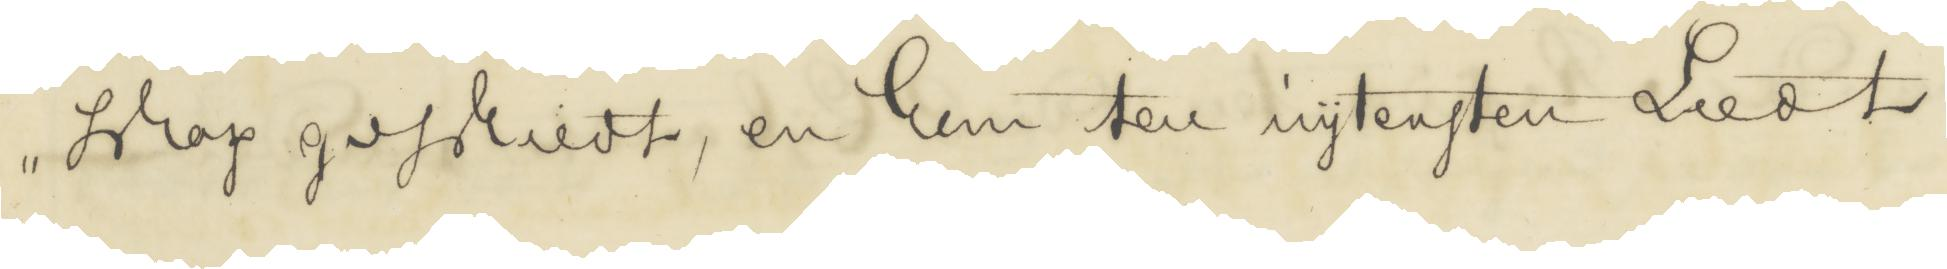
schap geschiedt, en hem ten uijtersten Leedt
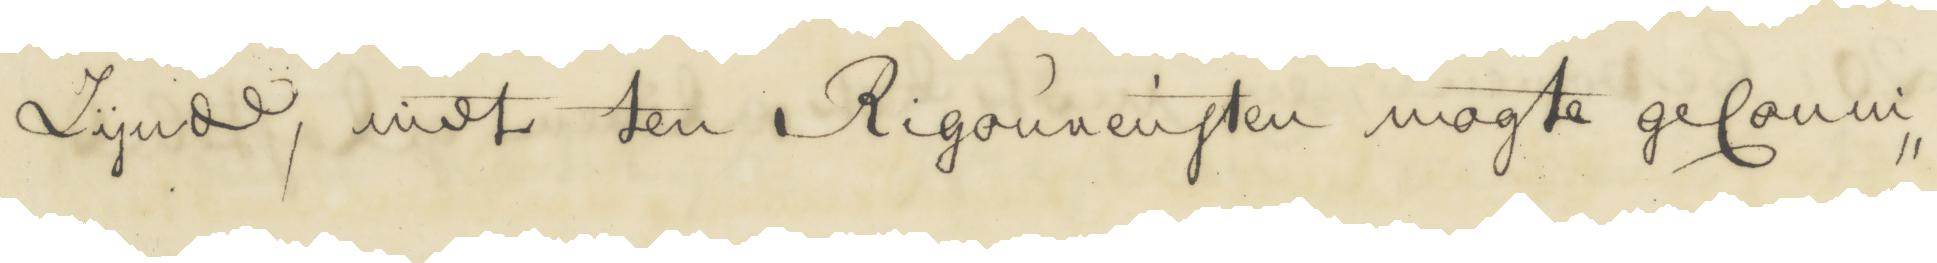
zijnde, niet ten Rigoureusten mogte gecorri„
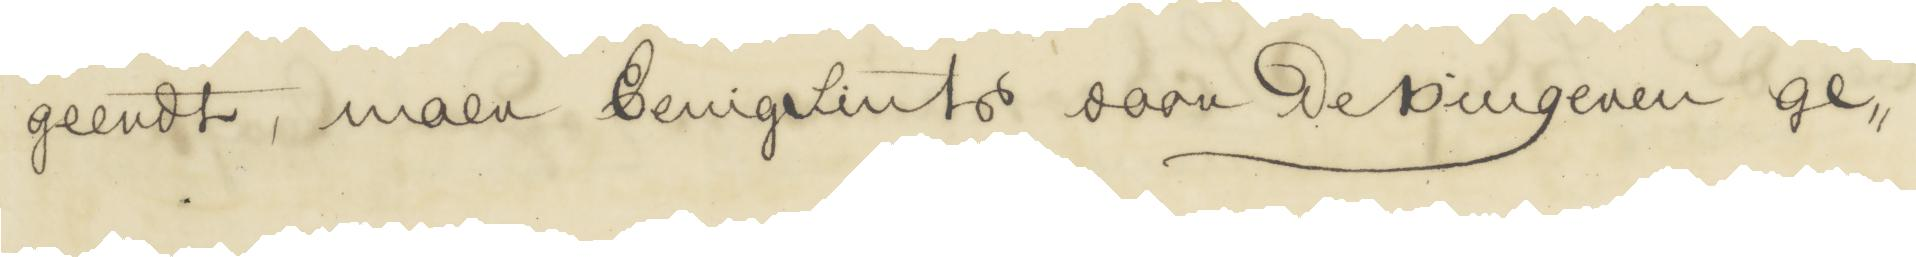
geerdt, maer Eenigsints door de vingeren ge„
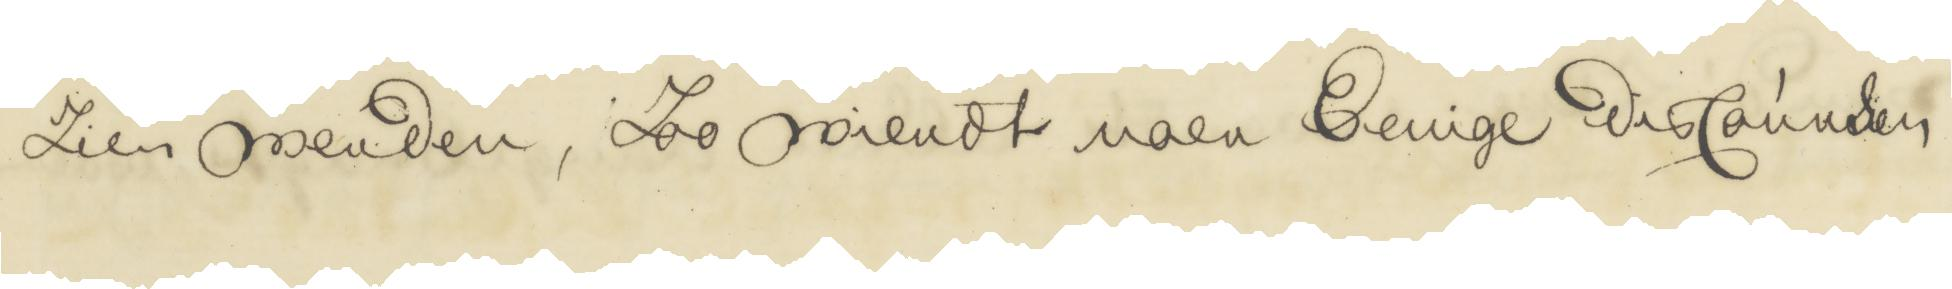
zien werden, zoo wierdt naer Eenige discoursen
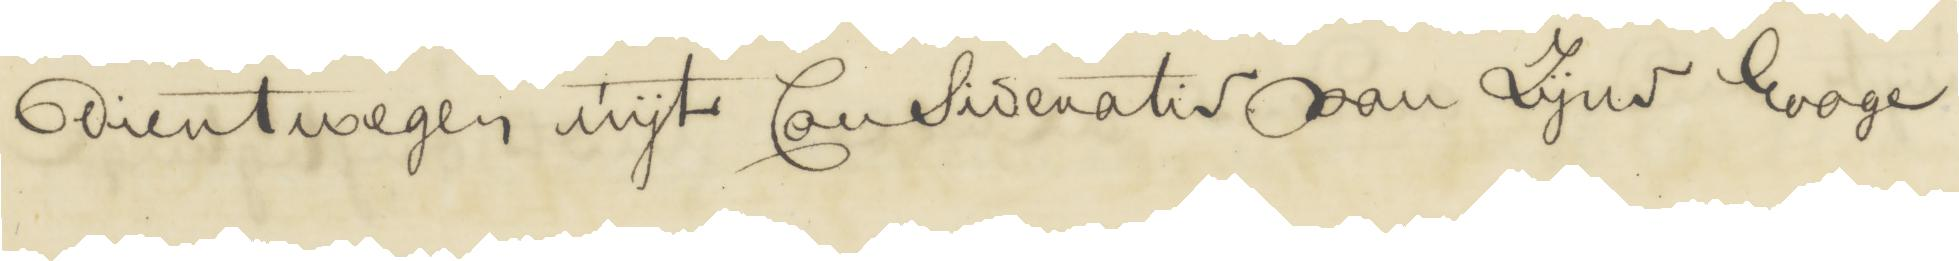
dientwegen uijt Consideratie van zijne hooge
